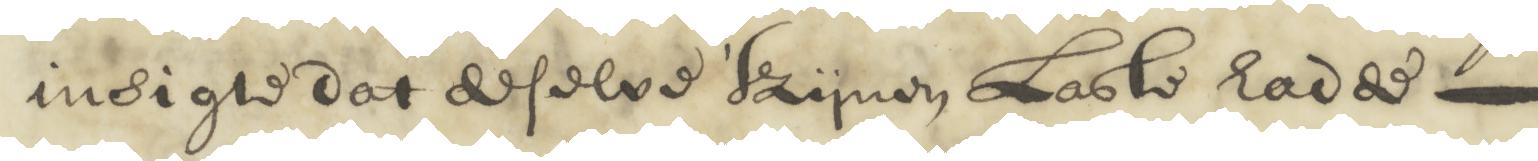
insigte dat deselve 't zijnen laste hadde —
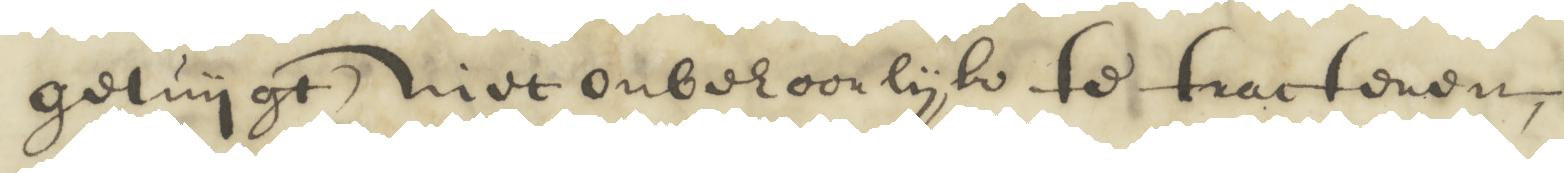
getuijgt) niet onbehoorlijk te tracteren,
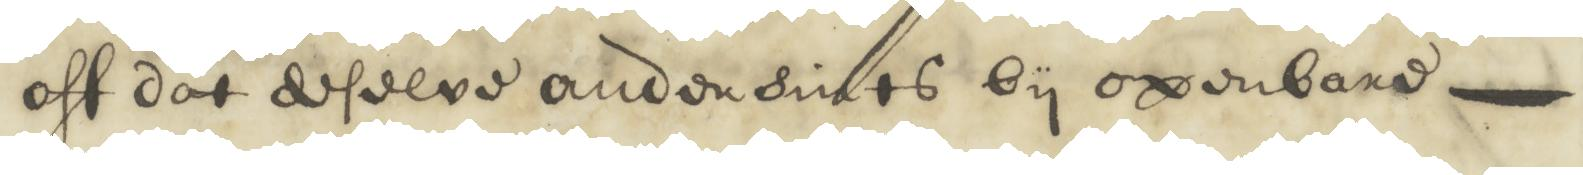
off dat deselve andersints bij openbare —
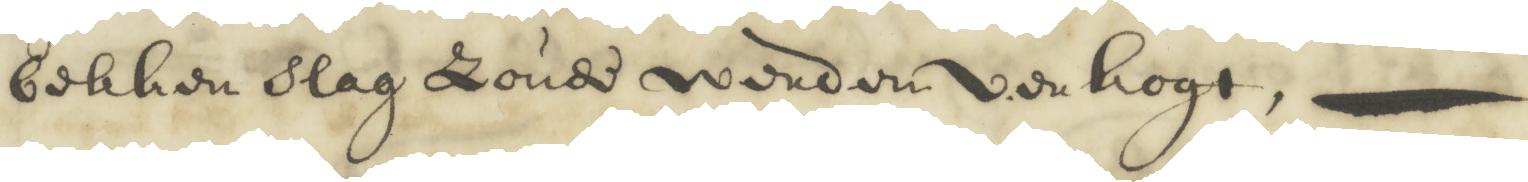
bekken slag zoude werden verkogt, —
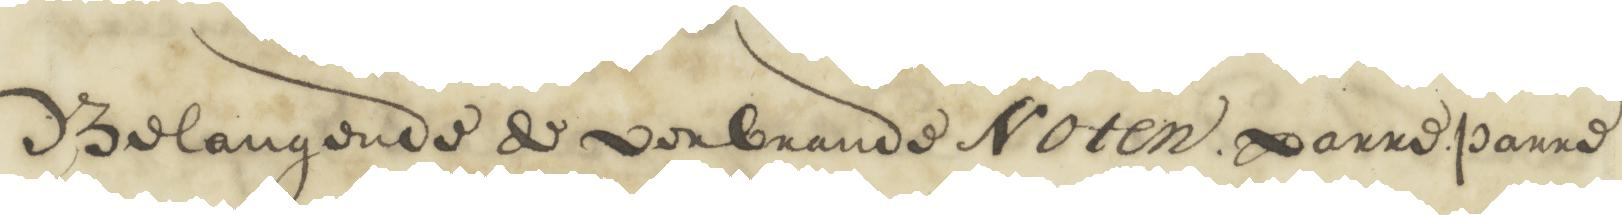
Belangende de verbrande Noten parre. parre
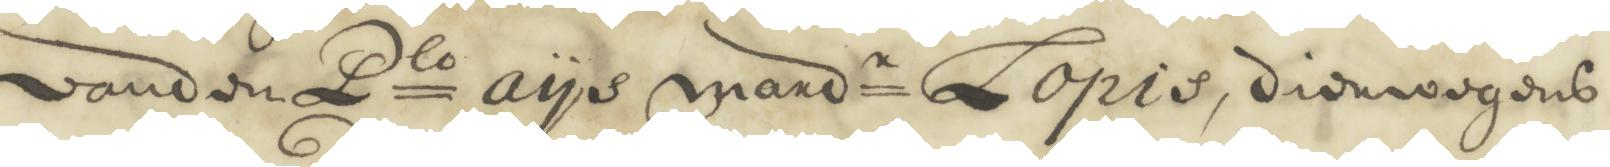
vanden P=lo aijs mard=r Lopis, dierwegens
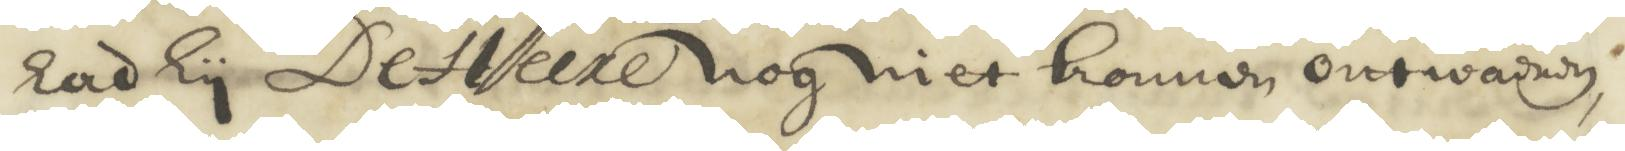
had hij De Heere nog niet konnen ontwaeren,
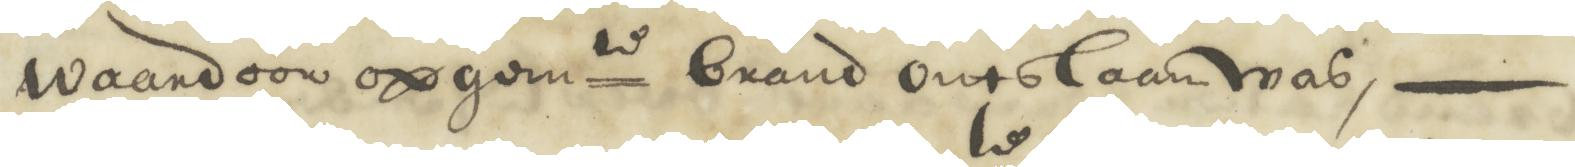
waardoor op gem=te brand ontstaan was, —
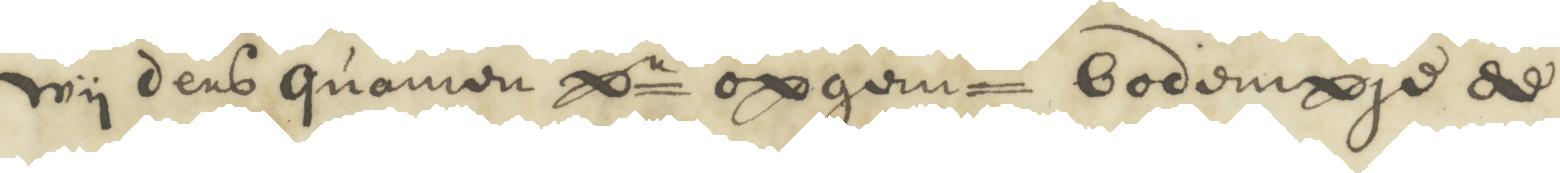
wijders quamen p=r op gem=te bodempje de
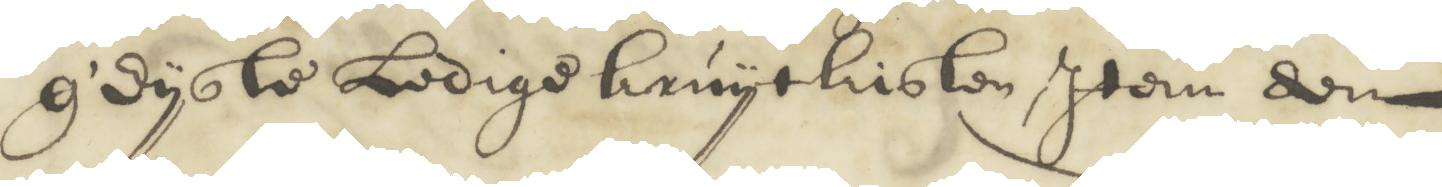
g’ Eijste Ledige kruijt kisten, Jtem den
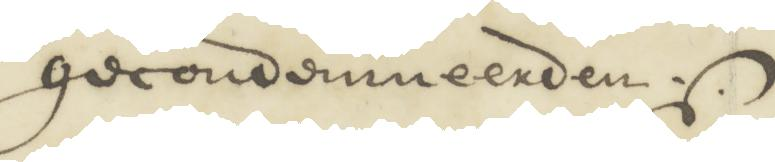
gecondemneerden . .
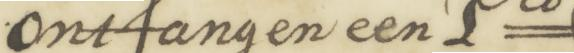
ontfangen een P=lo
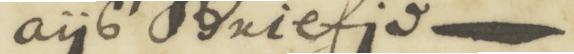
aijs Briefje —
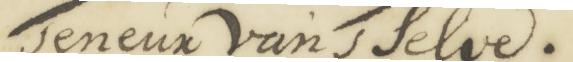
Teneur van 'T selve.
